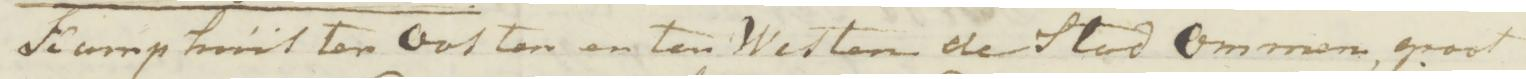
Kamphuis ter Oosten en ten Westen de stad Ommen, groot
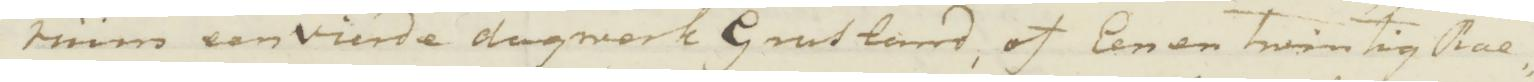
ruim een vierde dagwerk Grasland, of Een en twintig Roe„
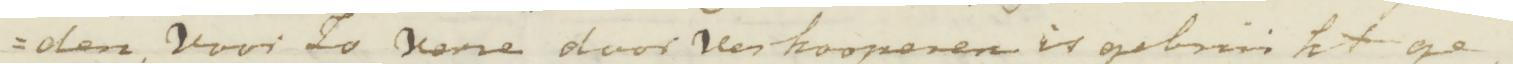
=den, voor Zo verre door verkooperen is gebruikt ge„
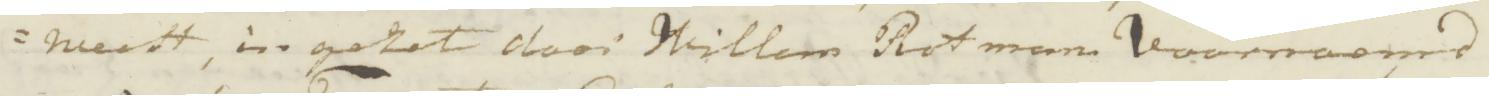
=weest, ingezet door Willem Rotman voornoemd
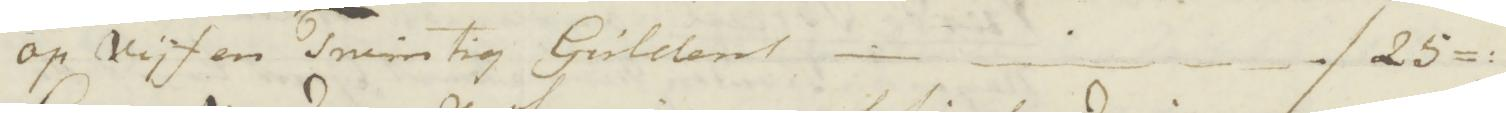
op vijf en Twintig Guldens —— — — — ƒ 25=
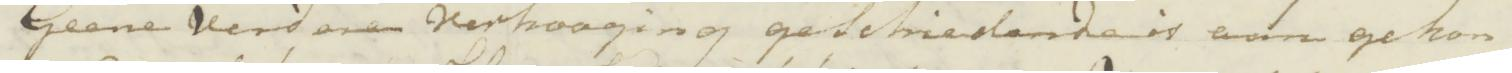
Geene verderen verhooging geschiedende is aan gekon
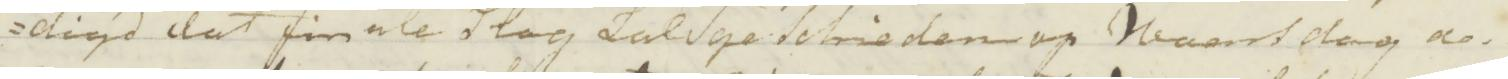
=digd dat finale Slag Zal geschieden op Woensdag de.
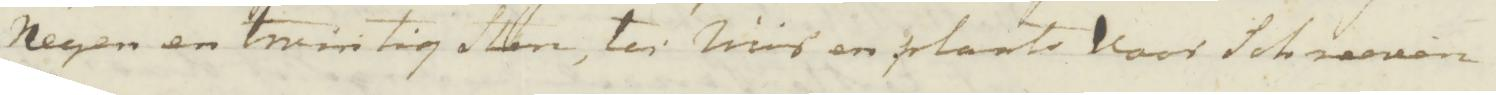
Negen en twintigsten, ten uur en plaats Voorschreeven
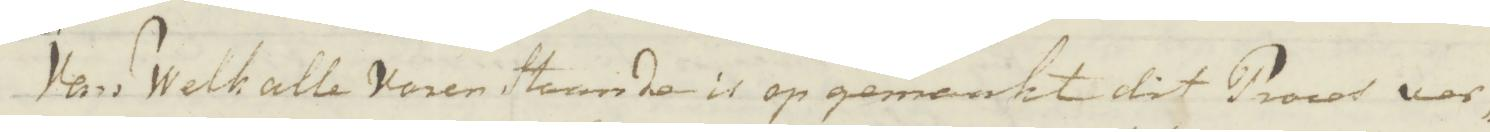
Van Welk alle Voren Staande is op gemaakt dit Proces ver„
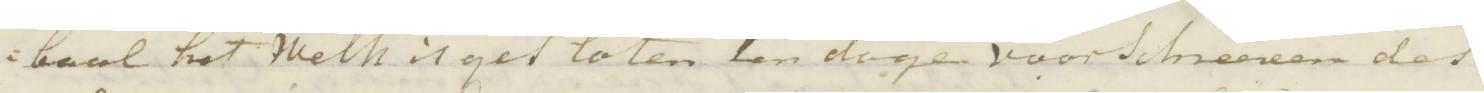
=baal het Welk is gesloten ten dage voorschreeven des
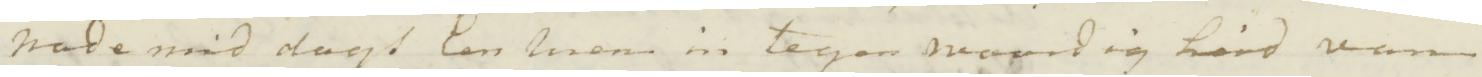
nademiddags Een uren in tegenwoordigheid van
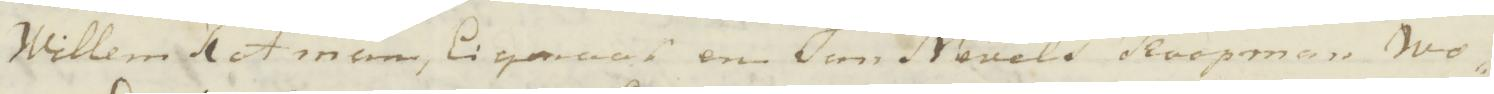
Willem Rotman, Eigenaar en Ian Nevels Koopman Wo„
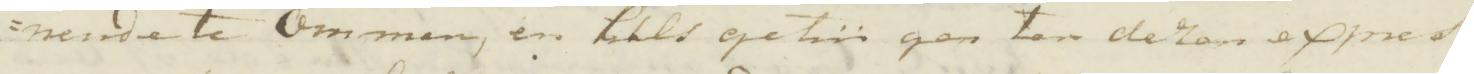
=nende te Ommen, en Als getuigen ten dezen expres
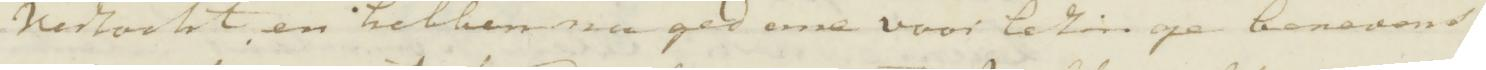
verzocht en hebben na gedane voor lezinge benevens
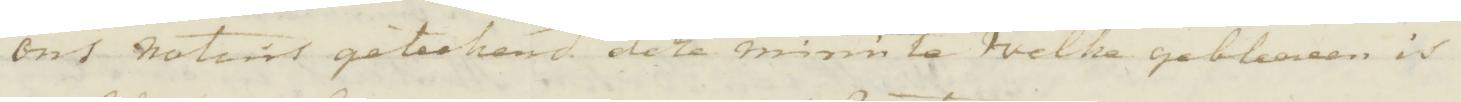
ons notaris geteekend deze minute welke gebleeveen is
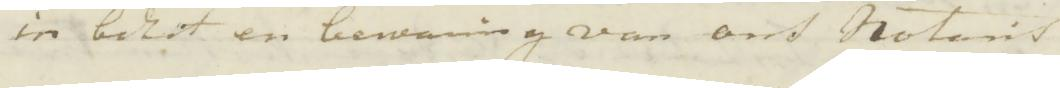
in bezit en bewaring van ons Notaris
